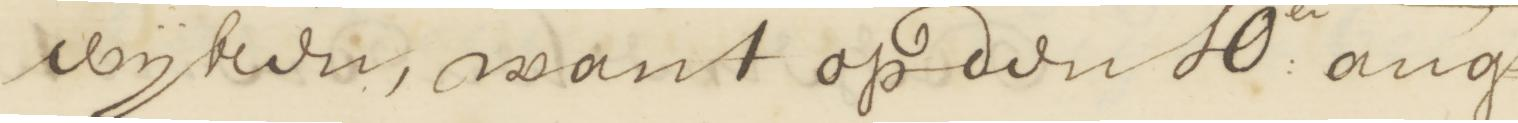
wijken, want op den 10:en aug=tus
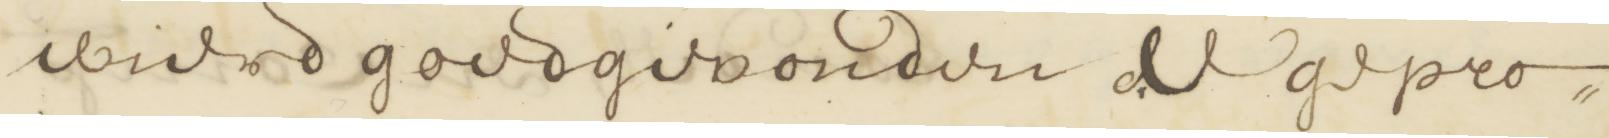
wierd goedgevonden de gepro„
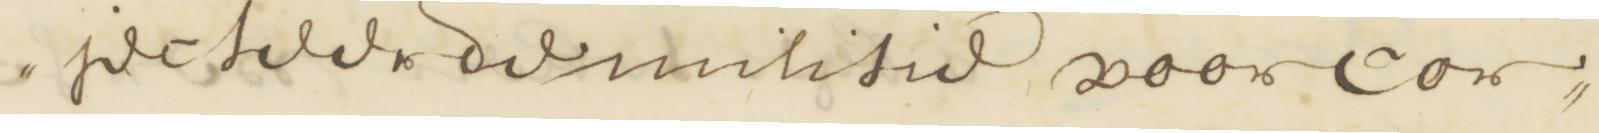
„ jecteerde militie voor Cor„
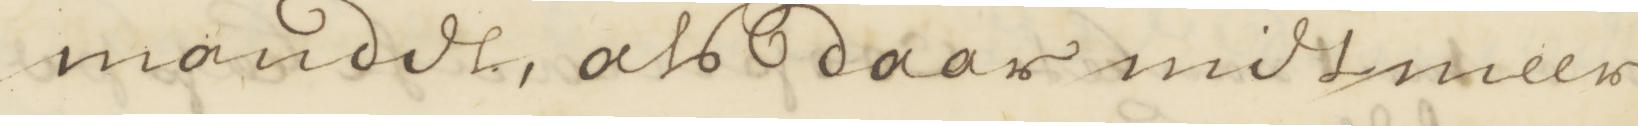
mandel, als daar niet meer
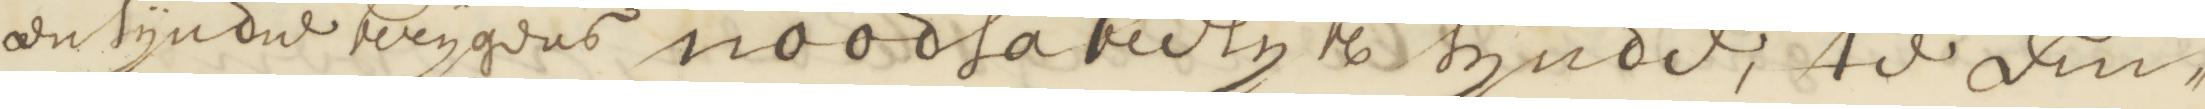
en sijn die krijgers noodsakelijk sijnde, te Em„
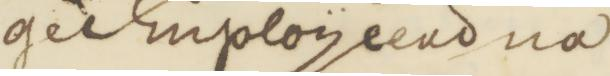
geEmploijeerd na
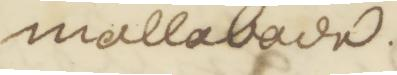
mallabaer.
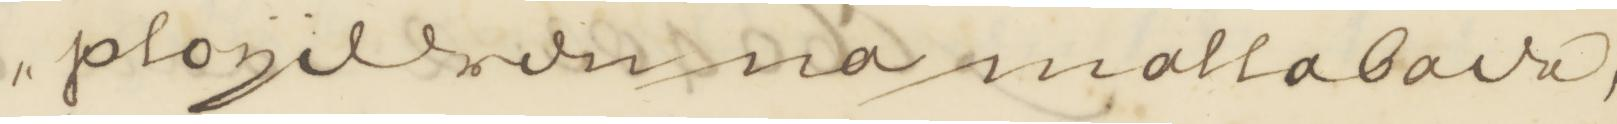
„ ploijeeren na mallabaer,
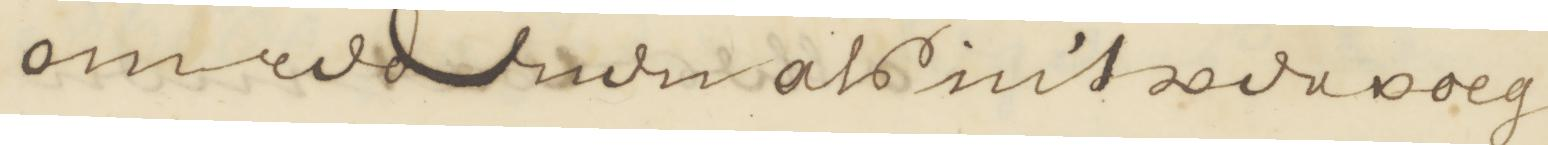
om redenen als in't vervolg
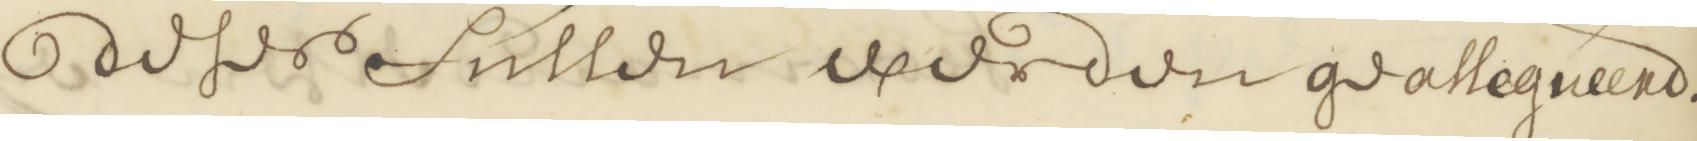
deses sullen werden geallegueerd
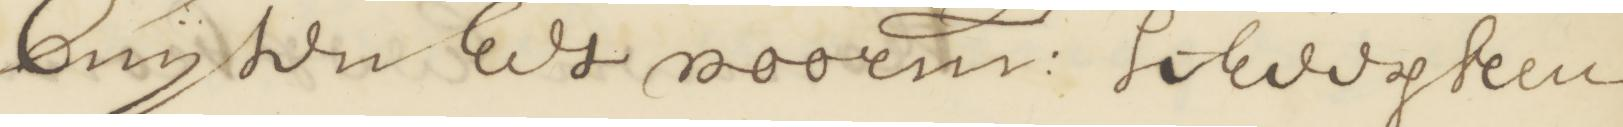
buijten het voorm: scheepken
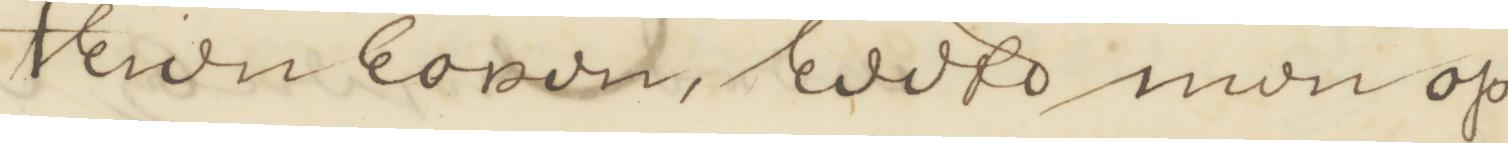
thienhoven, heefd men op
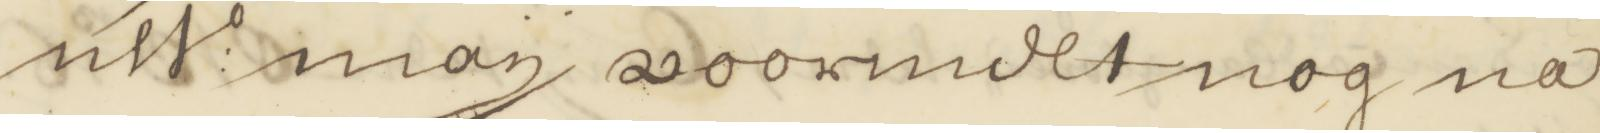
ult:o maij voormelt nog na
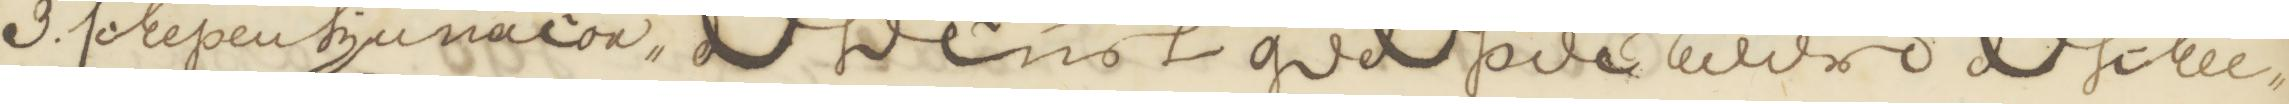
3. schepen sijn na con„ dese cust gedepecheerd de schee„
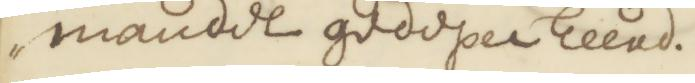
„mandel gedepecheerd.
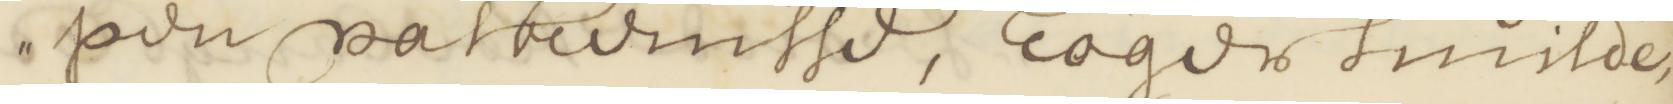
„pen valkenisse, hoger smilde,
